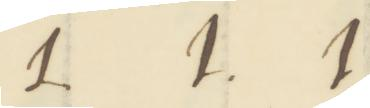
1. 1. 1
